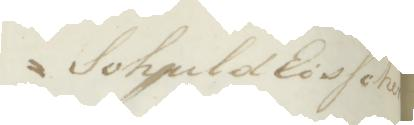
„schuld Eisscher
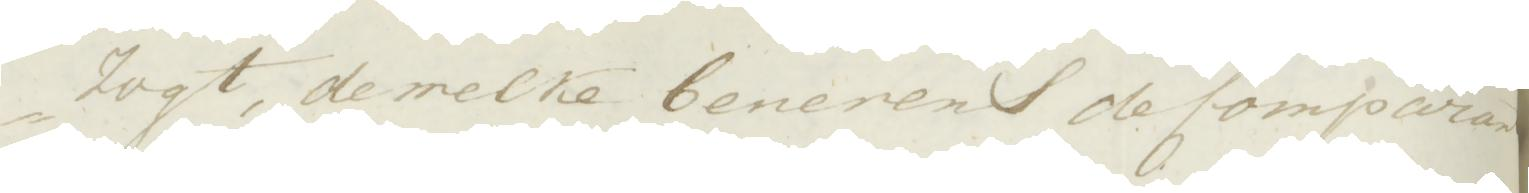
„zogt, de welke benevens de comparant
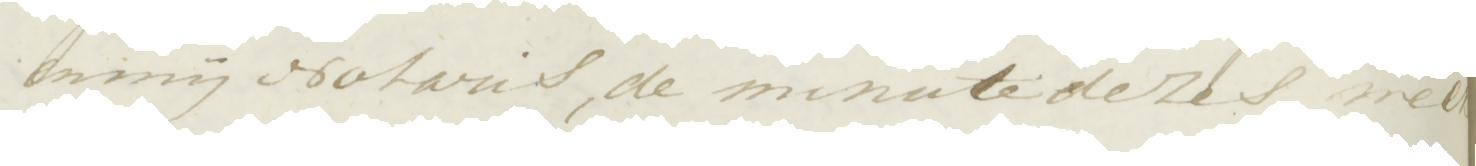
en mij Notaris, de minute dezes, wel
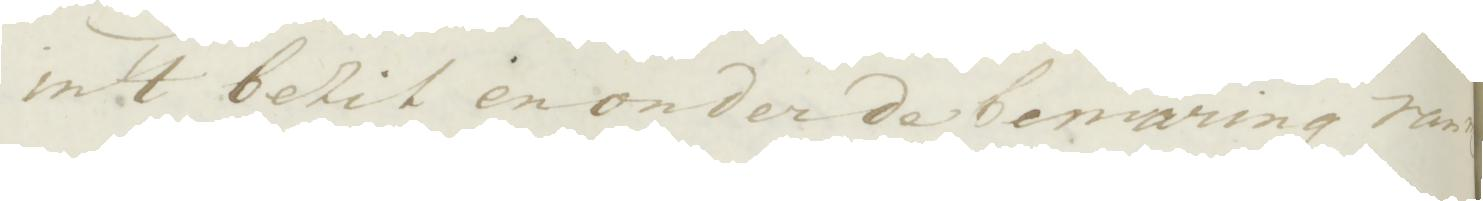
in ’t bezit en onder de bewaring van
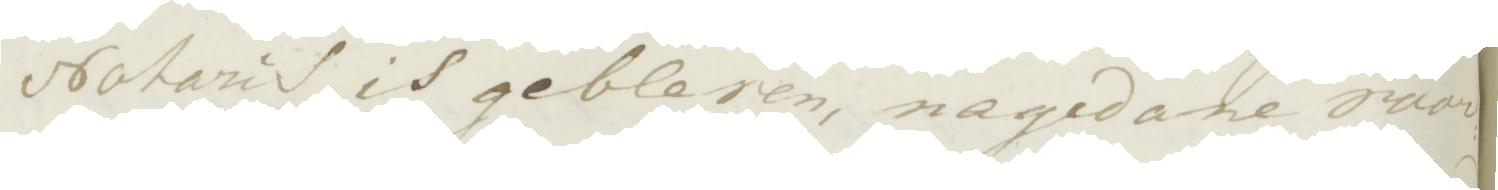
Notaris is gebleven, nagedane voor„
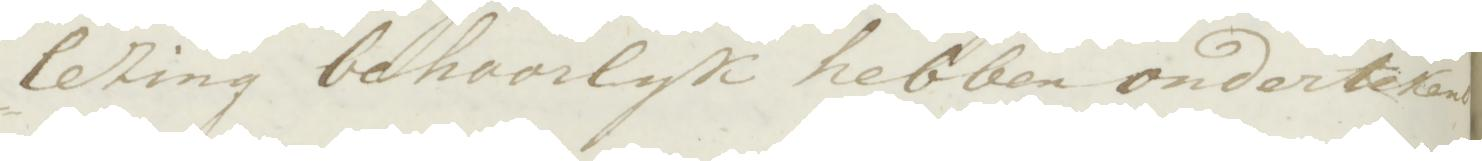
„lezing behoorlyk hebben ondertekend
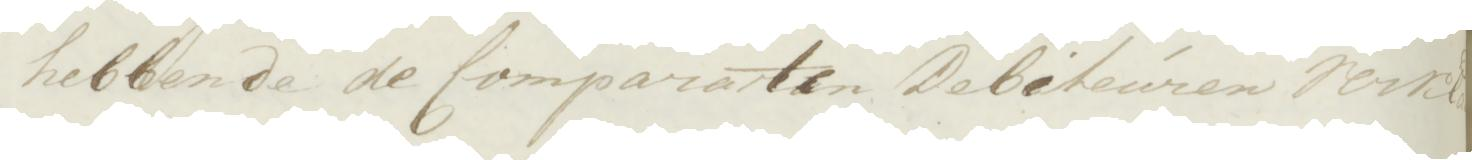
hebbende de Comparanten Debiteuren verkl
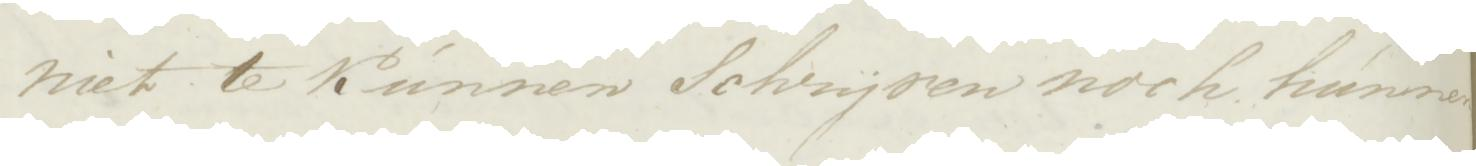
niet te kunnen schrijven noch hunne
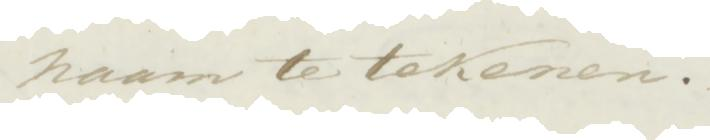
naam te tekenen.
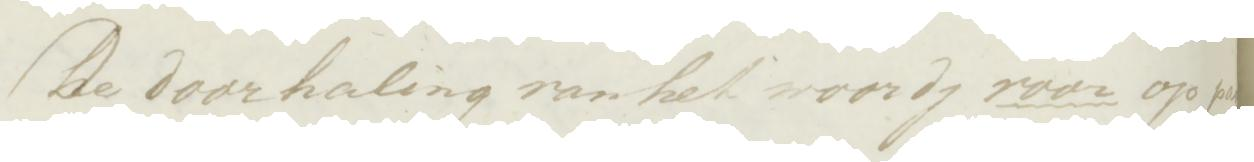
De door haling van het woordj voor op pa
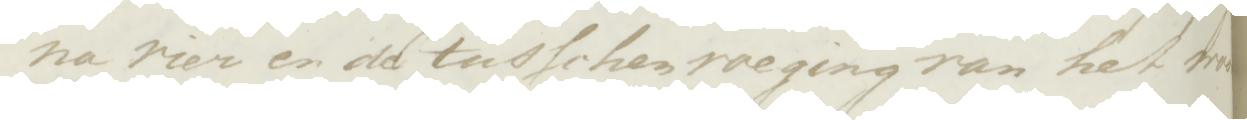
na vier en de tusschen voeging van het wo
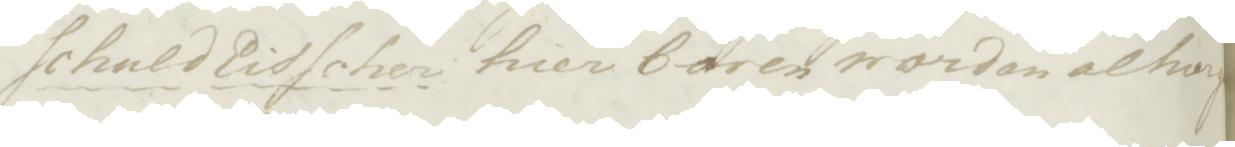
schuld Eisscher hier boven worden alhier g
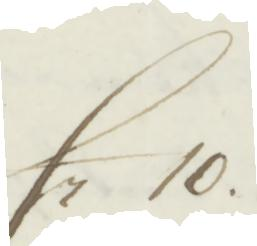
fr 10.
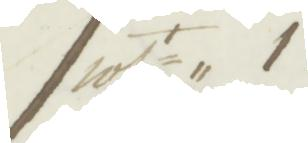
10t „ 1
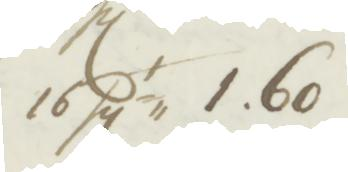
16/ij=t „ 1.60
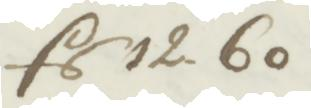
ƒs 12.60
